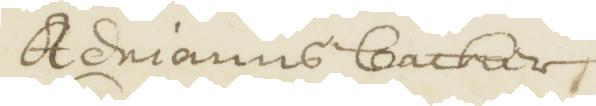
Adrianus backer,
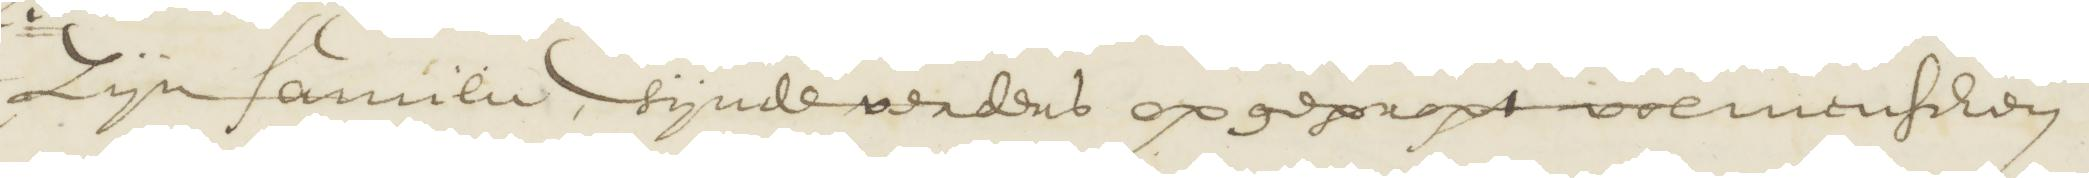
Zijn familie, sijnde verders opgepropt vol menschen
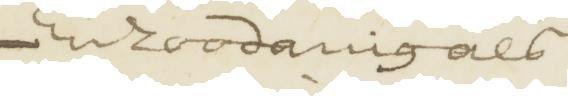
En zoodanig als
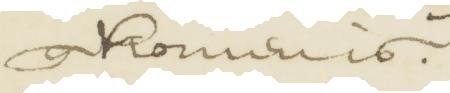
gekomen is.
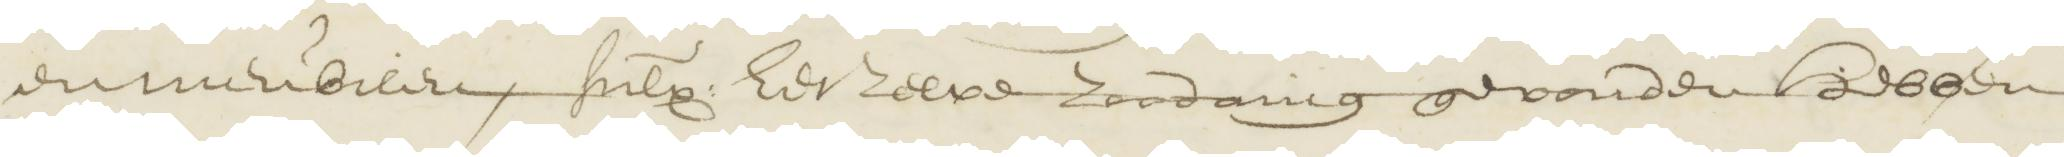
en meubilen, sulx: het zelve Zoodanig gevonden hebben
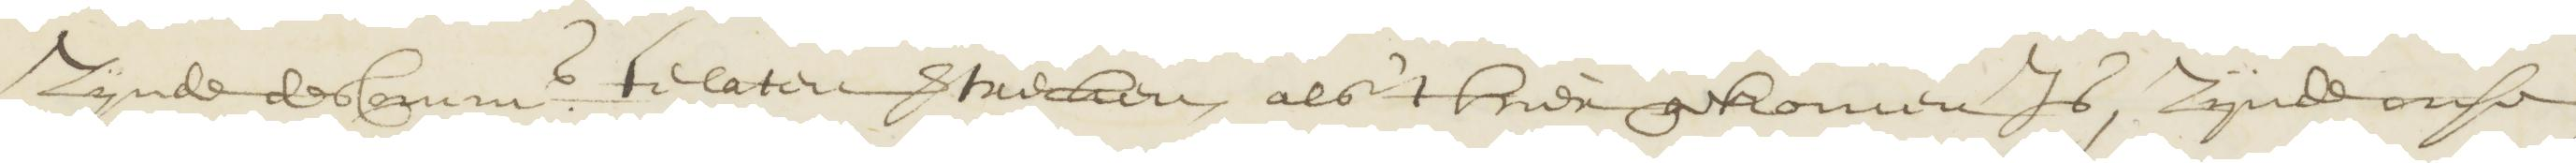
Zijnde de Comm:s telaten vertrecken, als ’t hier gekomen Is, Zijnde onse
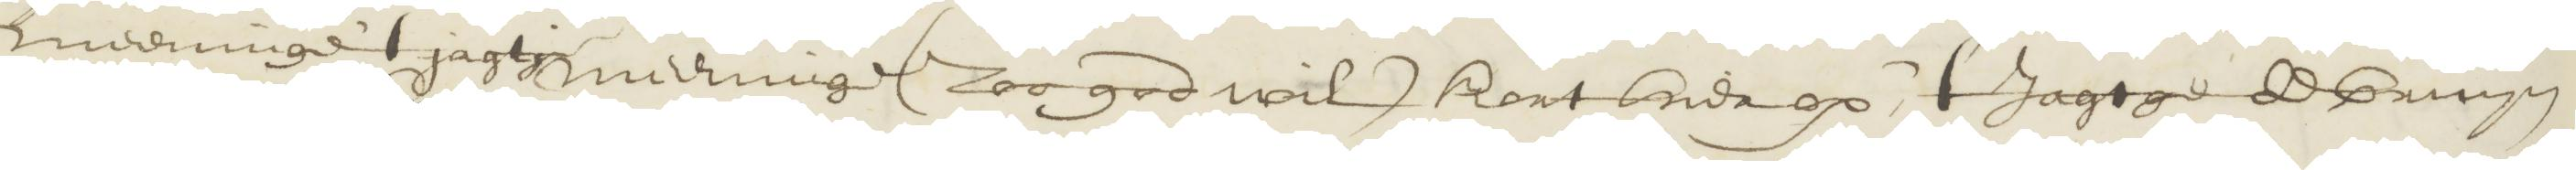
meeninge 't jagtje meeninge (Zoo god wil) kort hier op; ’t jagtge de bruijn
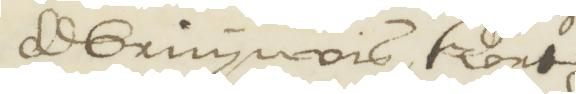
de bruijnvis, kort
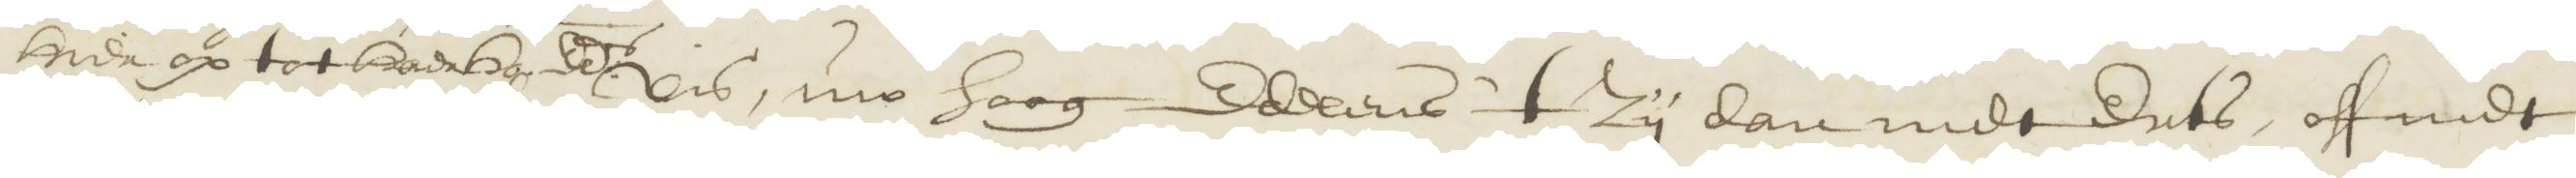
hier op tot haerho. Ed:s e Vis, uw hoog Edelens ’t Zij dan met erts, off met
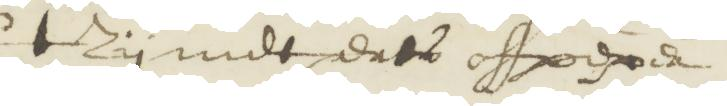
’t Zij met erts offpeper
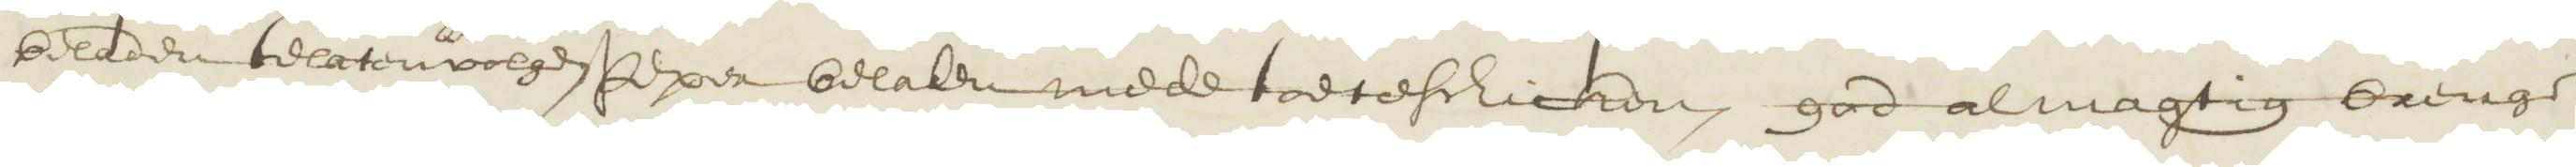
beladen telaten volgen Peper beladen mede toeteschicken, god almagtig brenge
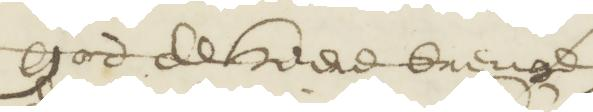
God de Heere brenge
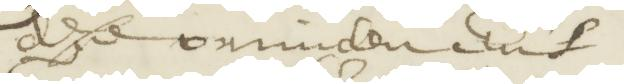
dese vrunden En ’t
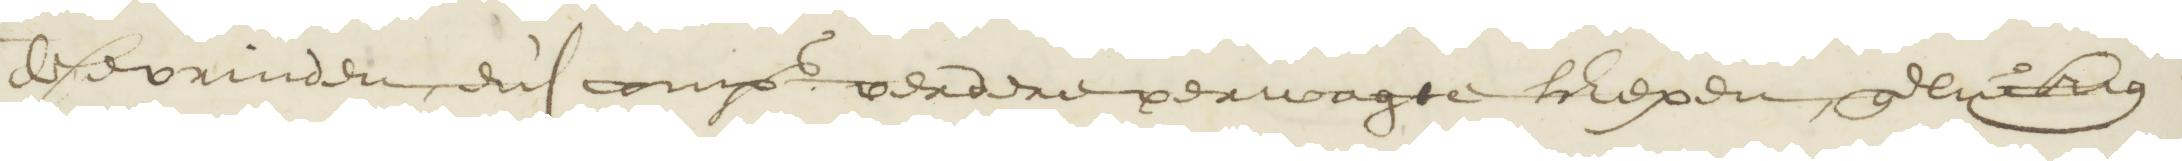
dese vrinden, en’s Comp:s verdere verwagte schepen, geluckig
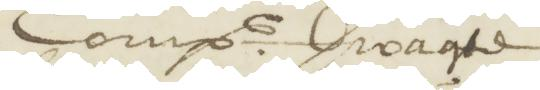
Comp=:s Verwagte
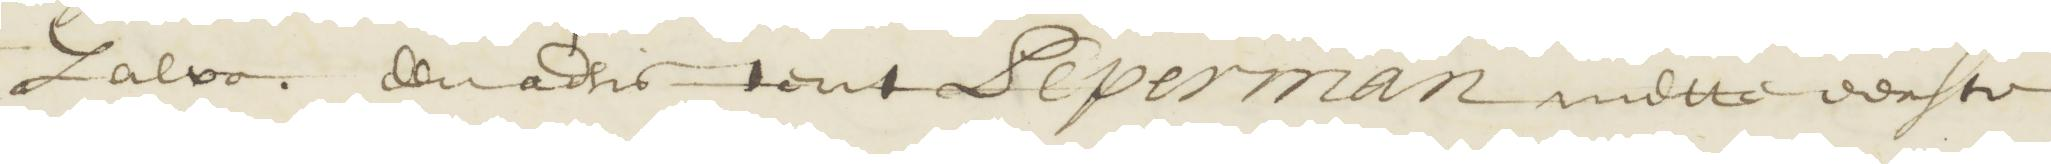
Zalvo. den adsistent Peperman mette eerste
